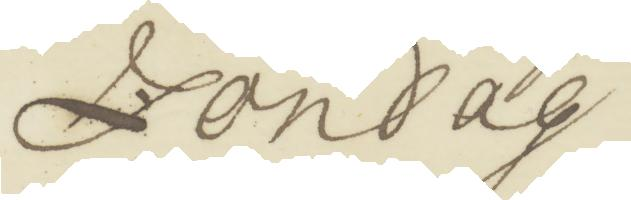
Zondag
